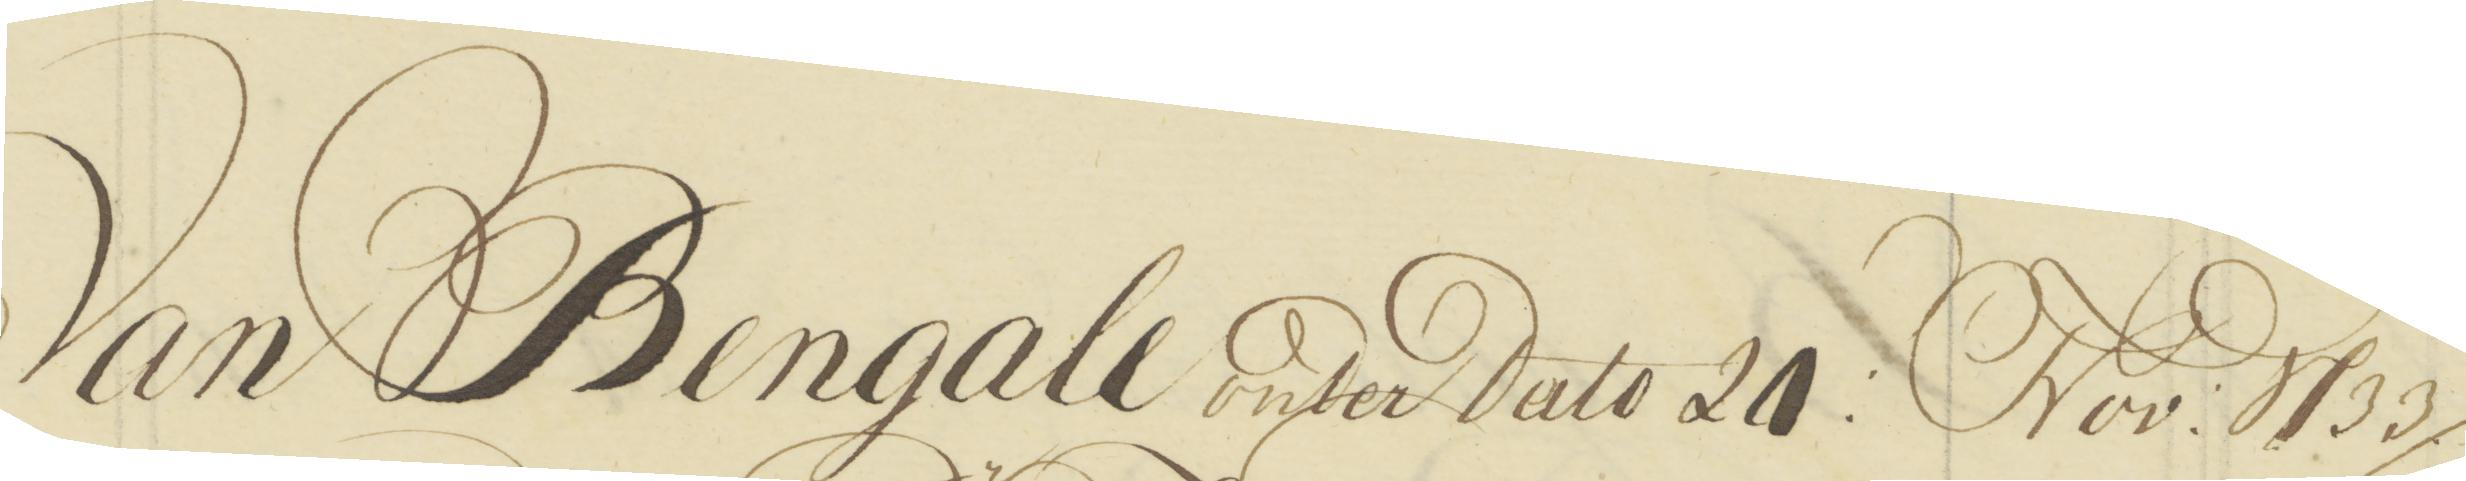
Van Bengale onder dato 24:' Nov 1733.
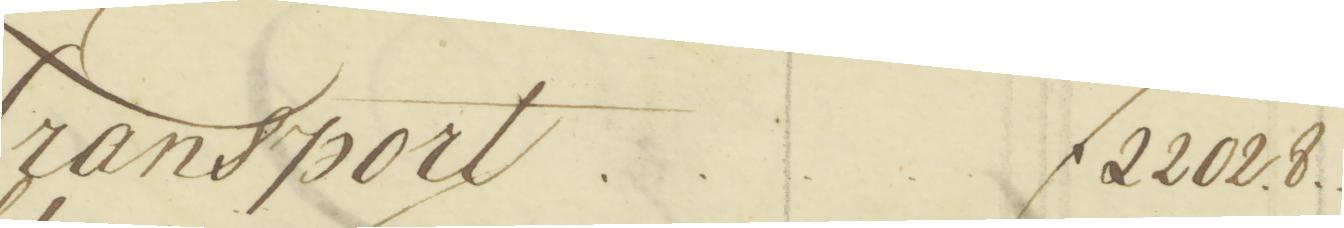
Transport . . . . .ƒ 2202.8.
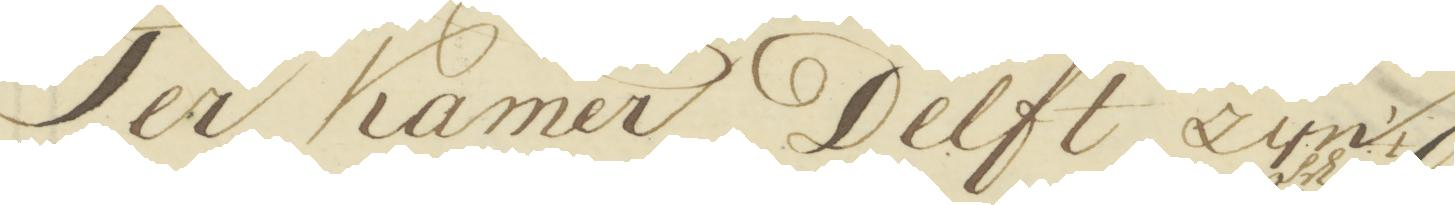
Ter kamer Delft zijn
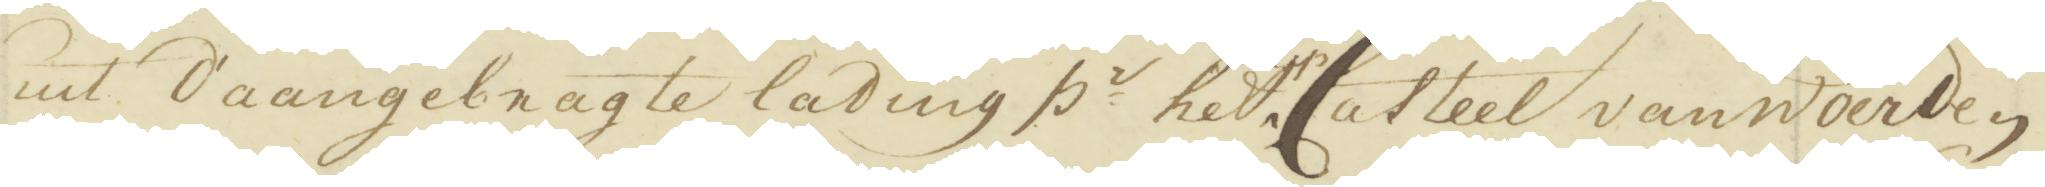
uit d'aangebragte lading p:r het ^ Casteel van Woerden
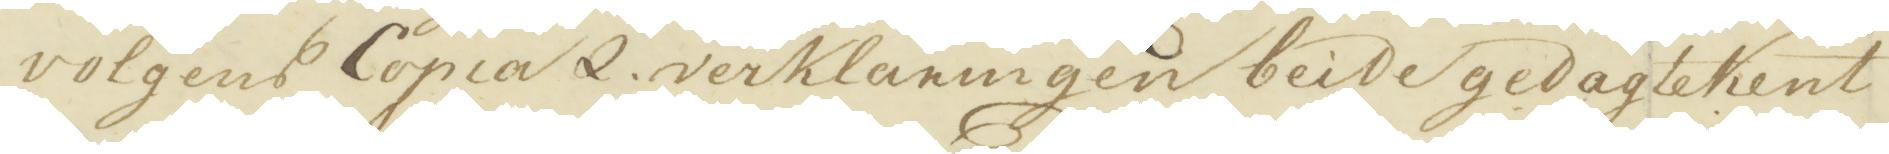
volgens Copia 2. verklaringen beide gedagtekent
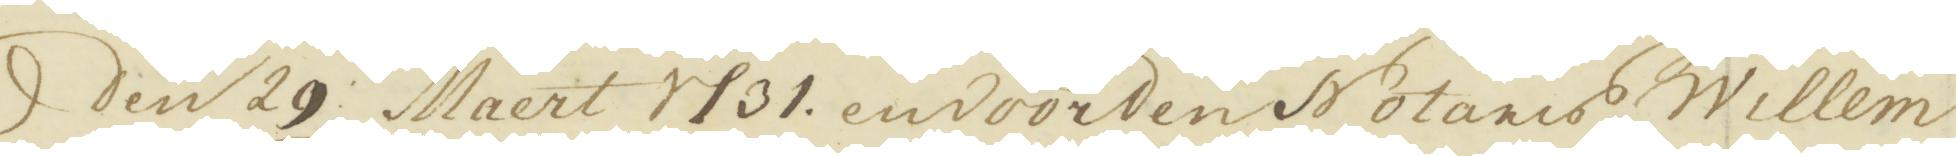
den 29:' Maert 1731. en voor den Notaris Willem
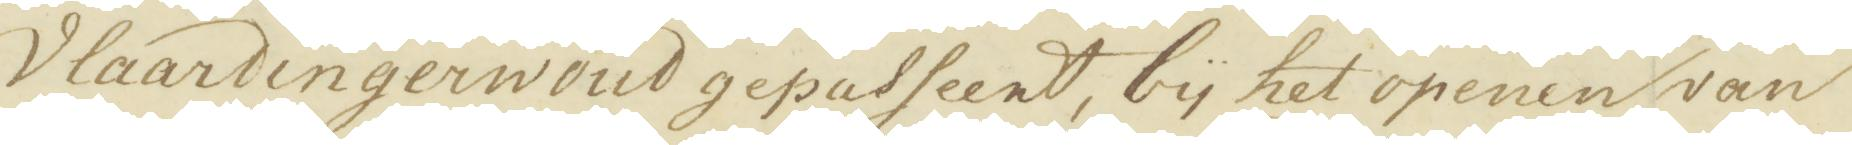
Vlaardingerwoud gepasseert, bij het openen van
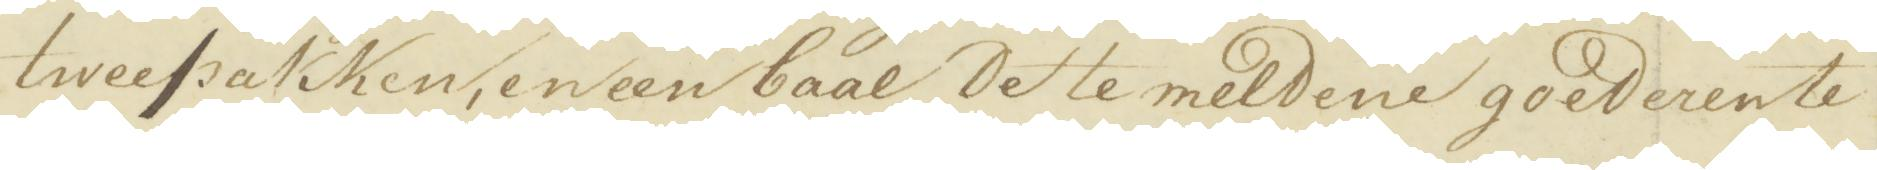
twee pakken, en een baal de te meldene goederen te
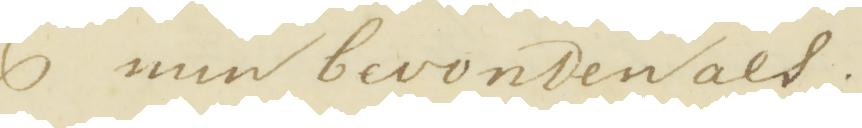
min bevonden als.
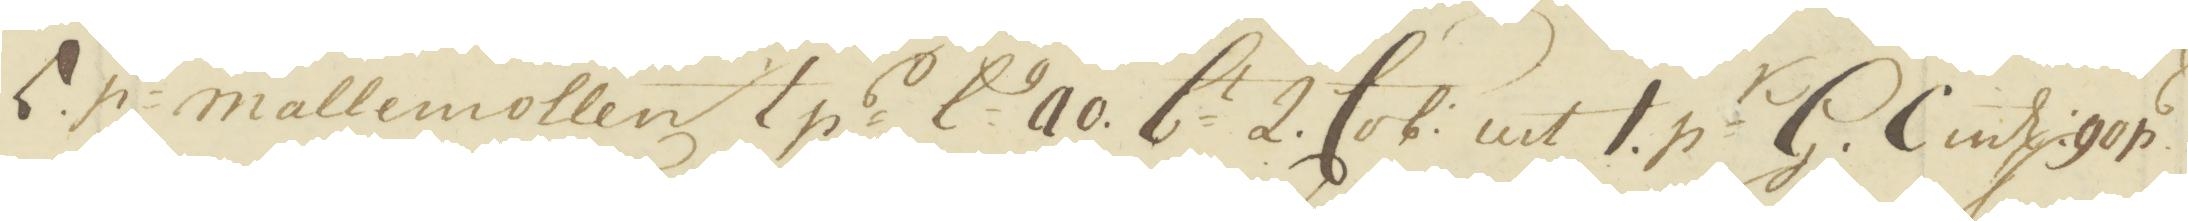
5. p:s mallemollen 't p:s l:g 40. b=t 2: Cob: uit 1. p:k G: C inh: 90p:s
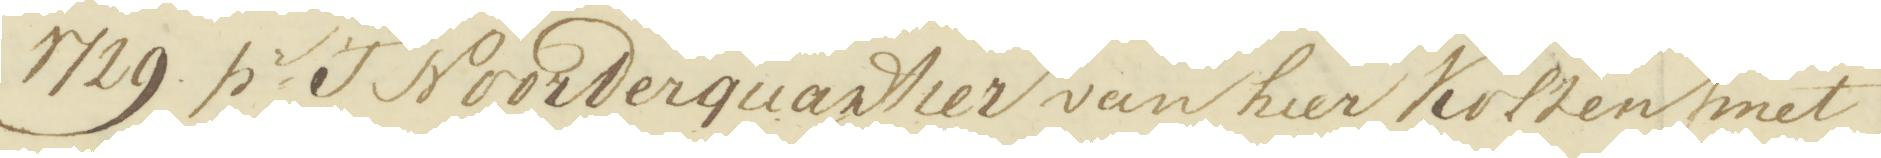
1729. p:r 'T Noorderquartier van hier kosten met
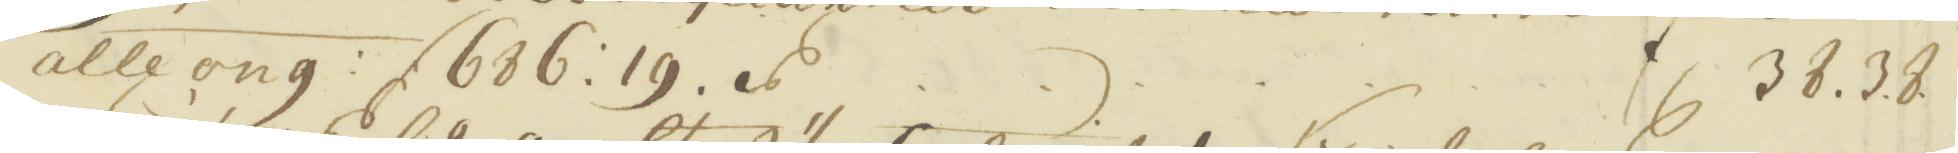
alle ong: ƒ 686:19. is. . . . . . . ƒ 38. 3.8.
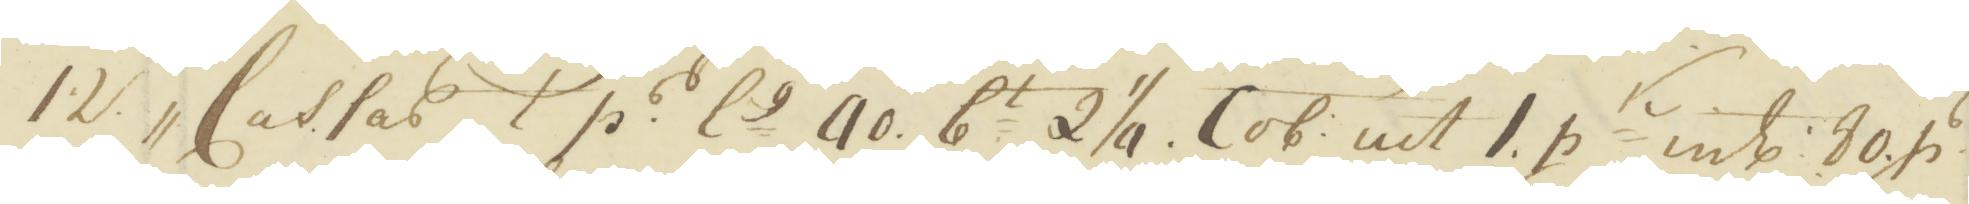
12. „ Cassas 't p:s l=g 40. b=t 2¼. Cob: uit 1. p=k inh: 80 p:s
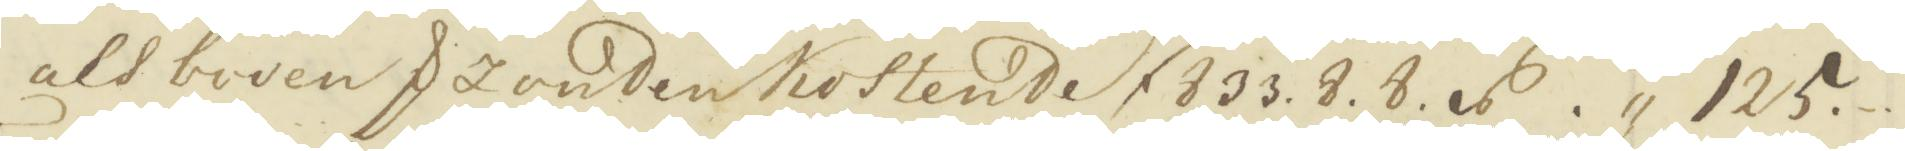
als boven Verzonden Kostende ƒ 833. 8. 8. is . „ 125. - .
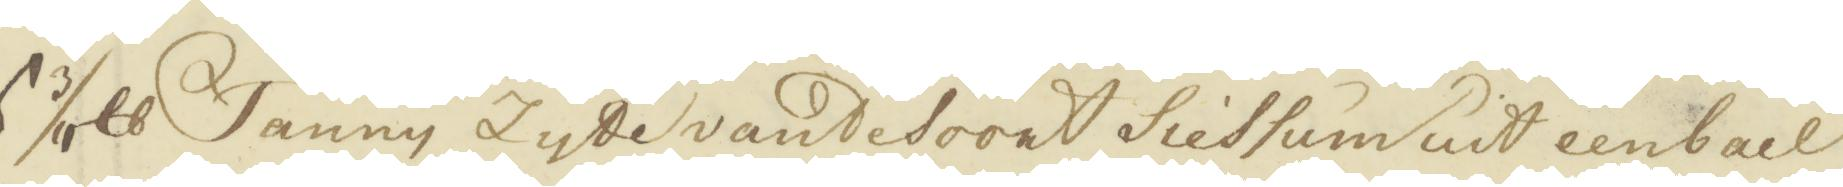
5 ¾ lb Tannij Zijde van de Soort Siessum uit een bael
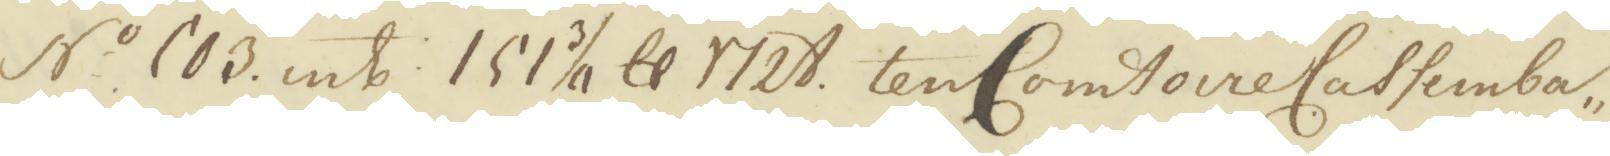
N.o 503. inh: 151¾ lb 1728. ten Comtoire Cassemba„
